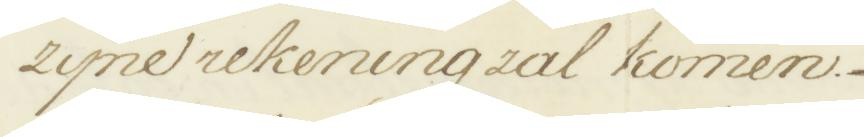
zyne rekening zal komen.
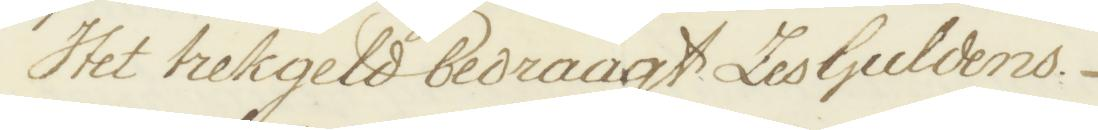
Het trekgeld bedraagt Zes Guldens.
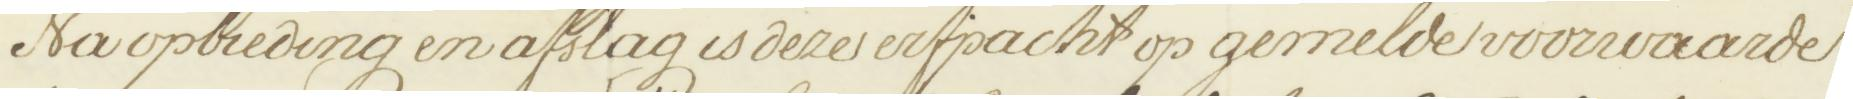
Na opbieding en afslag is deze erfpacht op gemelde voorwaarde
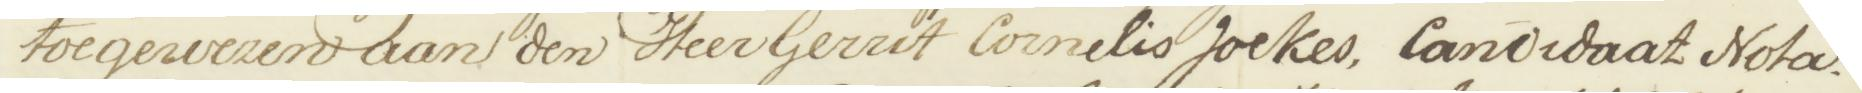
toegewezen aan den Heer Gerrit Cornelis Joekes, Candidaat Nota.
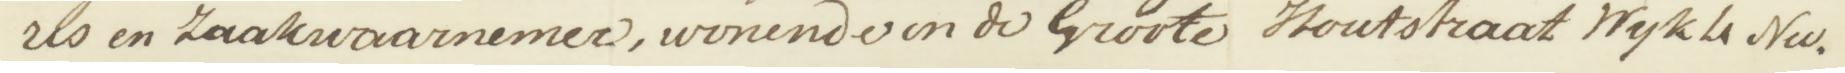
ris en zaakwaarnemer, wonende in de Groote Houtstraat Wyk 4 Nu.
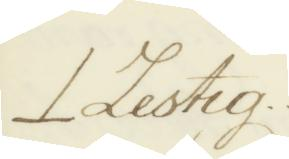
¶ Zestig.
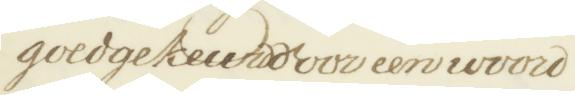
goedgekeurd voor een woord
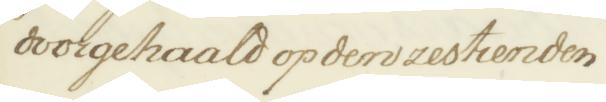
doorgehaald op den zestienden
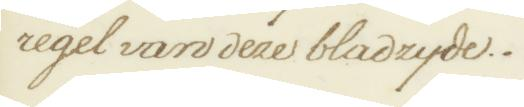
regel van deze bladzyde.
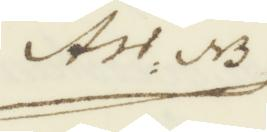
Art: N3
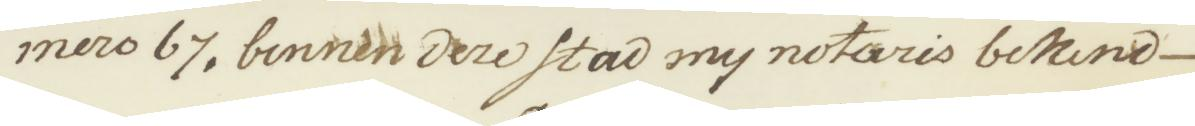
mero 67, binnen deze stad my notaris bekend
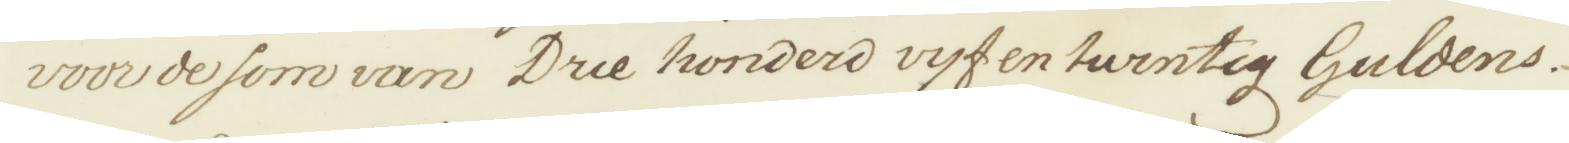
voor de som van Drie honderd vyf en twintig Guldens
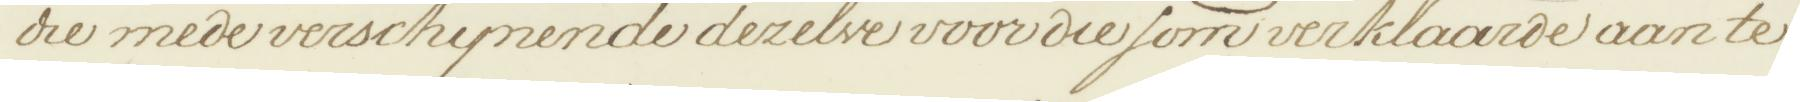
die mede verschynende dezelve voor die som verklaarde aan te
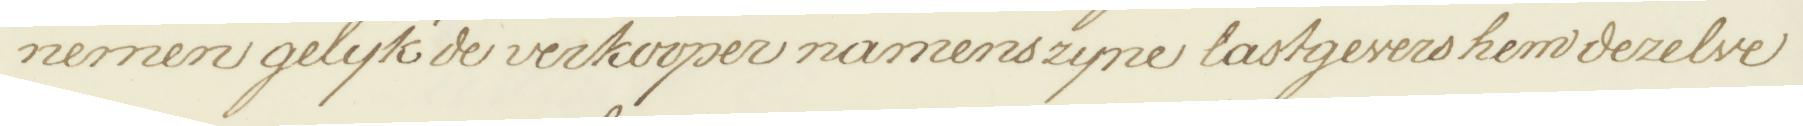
nemen gelyk de verkooper namens zyne lastgevers hem dezelve
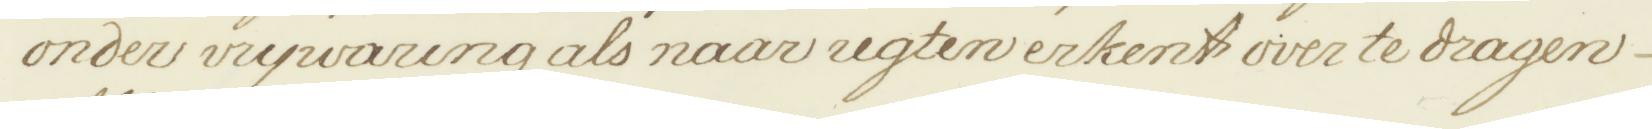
onder vrywaring als naar regten erkent over te dragen
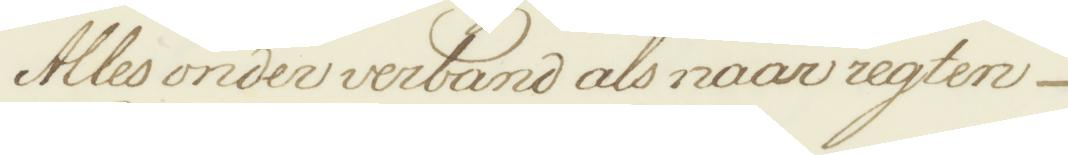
Alles onder verband als naar regten
